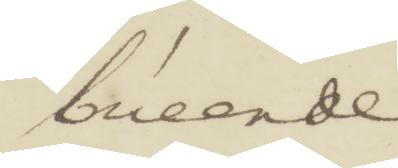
bueerde
